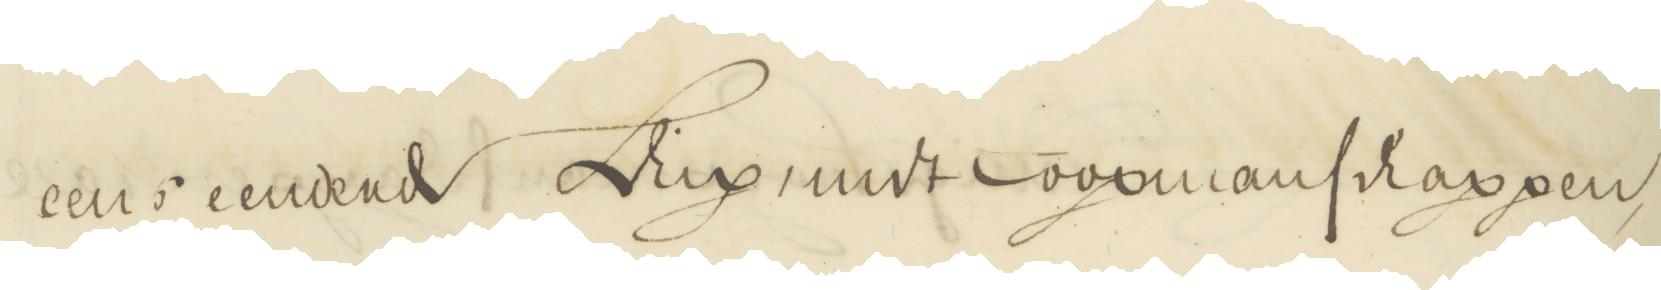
een 5 eenderde schip, met coopmanschappen,
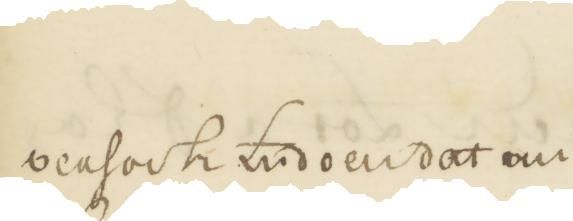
versoek tedoen dat om
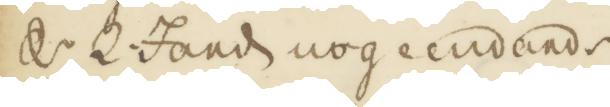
de 2-Jaren nog eendarde
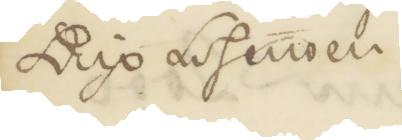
Schip tesenden
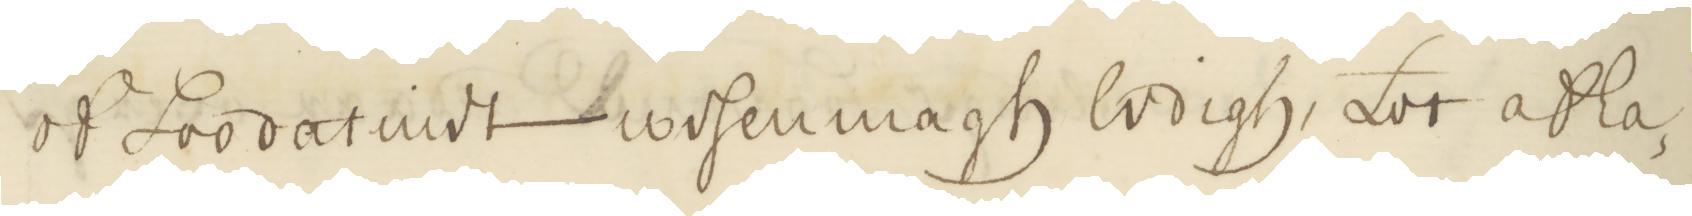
of soo dat niet wesen magh ledigh, tot afha„
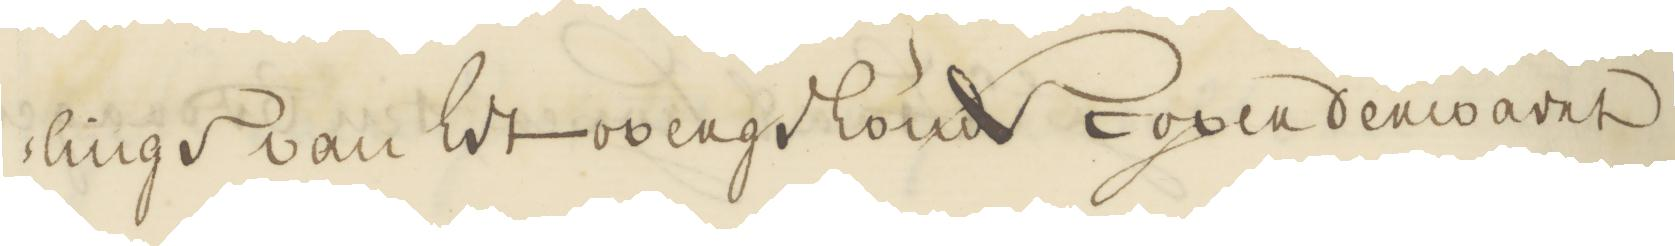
linge van het overgehoude coper derwaert
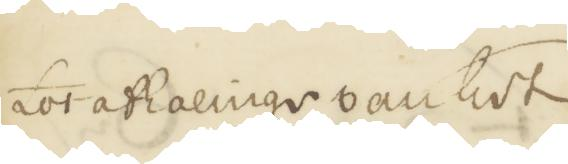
tot afhalinge van het
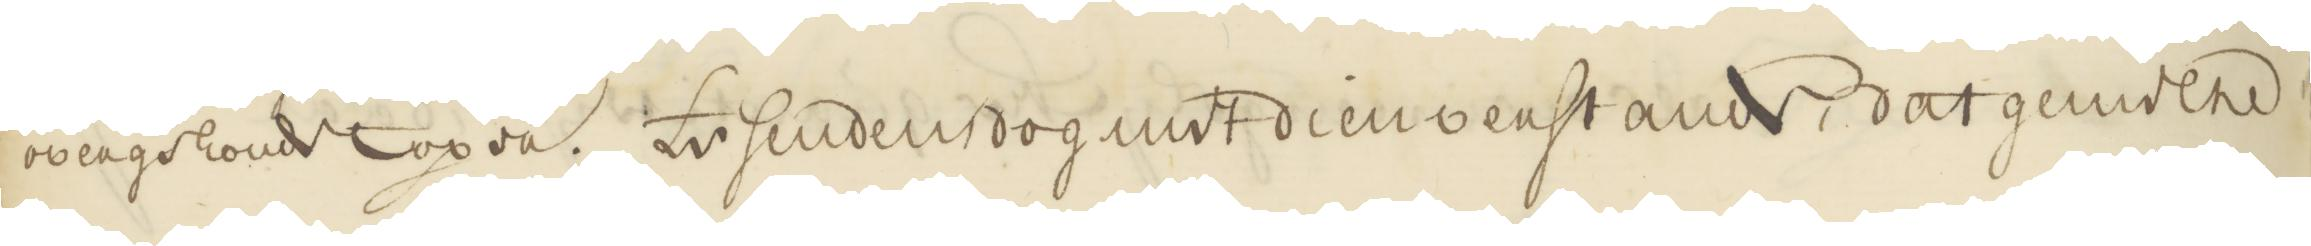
overgehoude Coper. Te senden, dog met dien verstande, dat gemelte
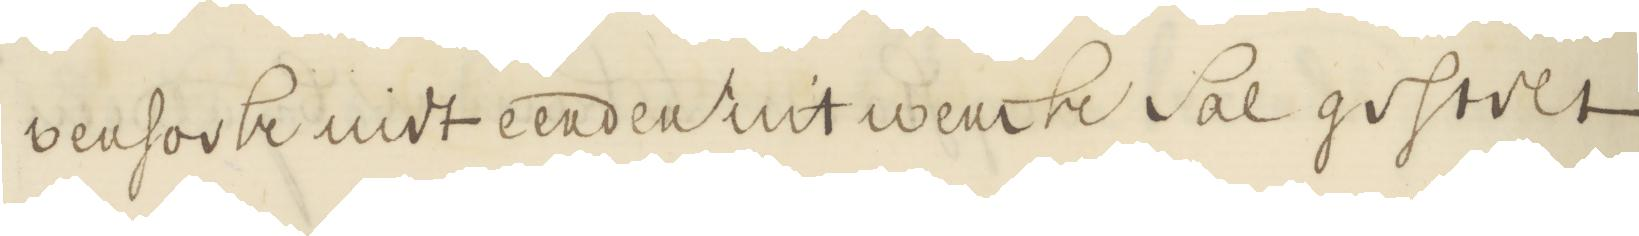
versoek niet eerden in't werck sal gestelt
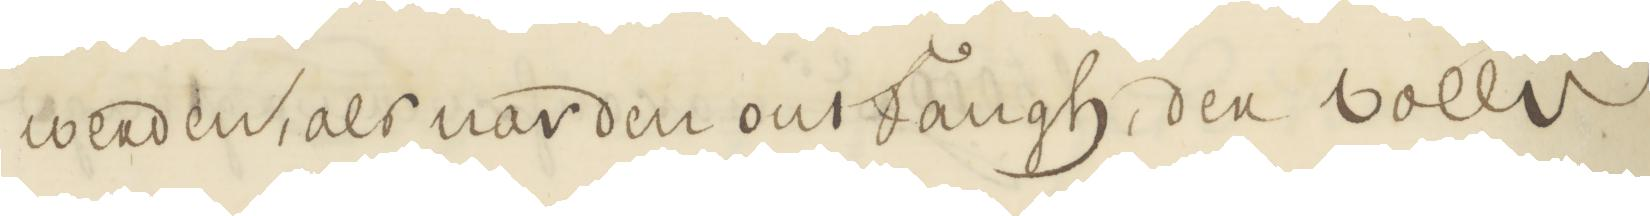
werden, als nae den ontfangh, der volle
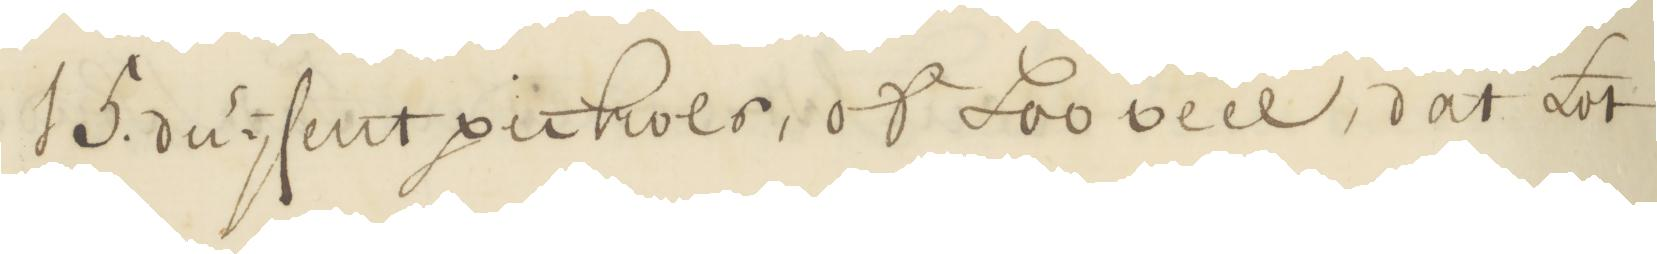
15. duijsent pickols, of soo veel, dat tot
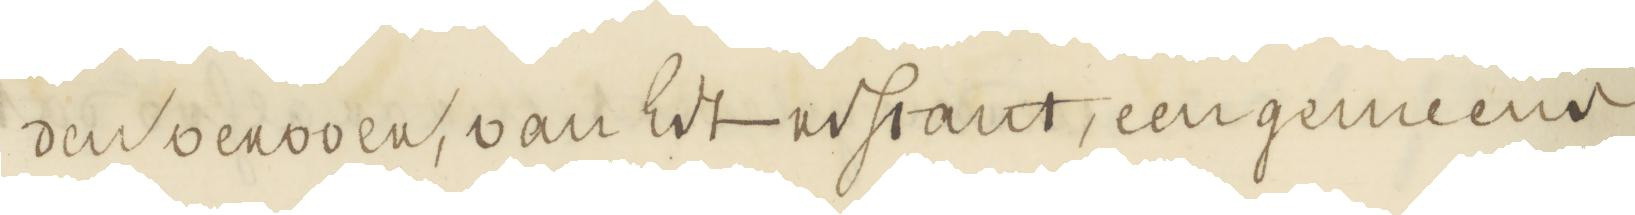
den vervoer, van het restant, een gemeene
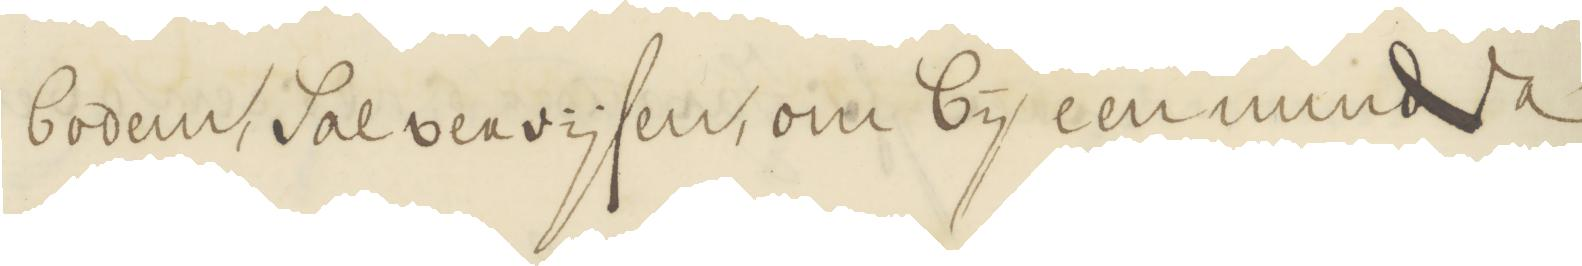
bodem, sal vereijsen, om bij een minder
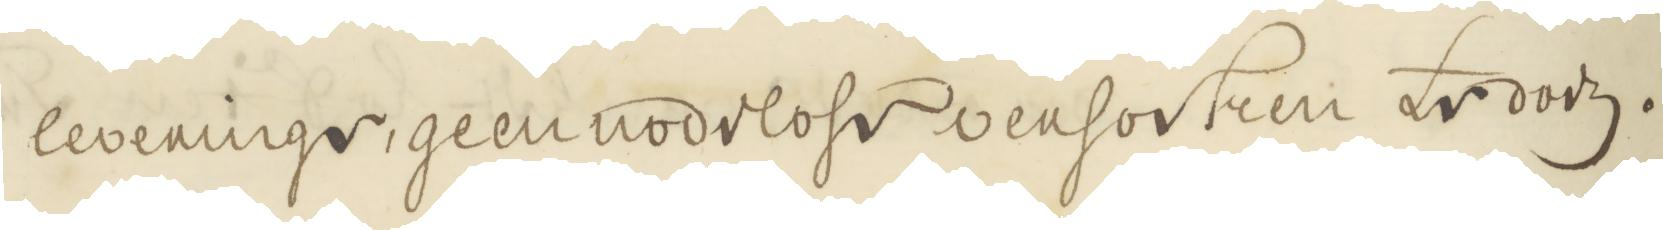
leveringe, geen nodelose versoeken te doen.
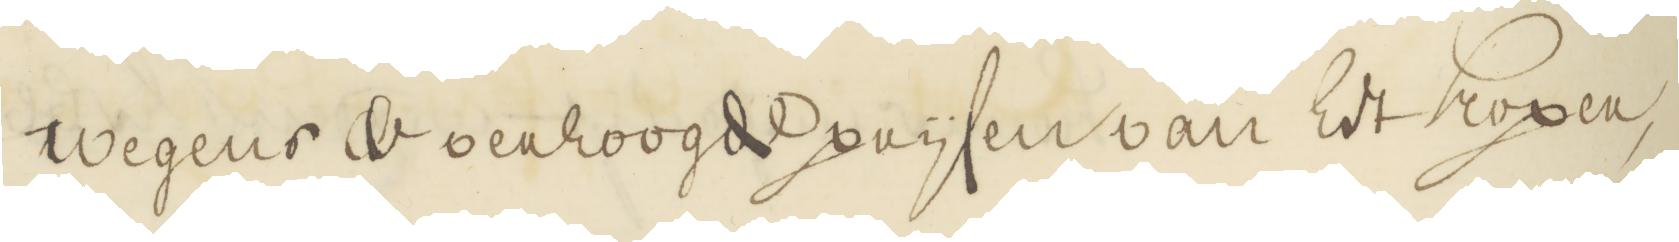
wegens de verhoogde prijsen van het koper,
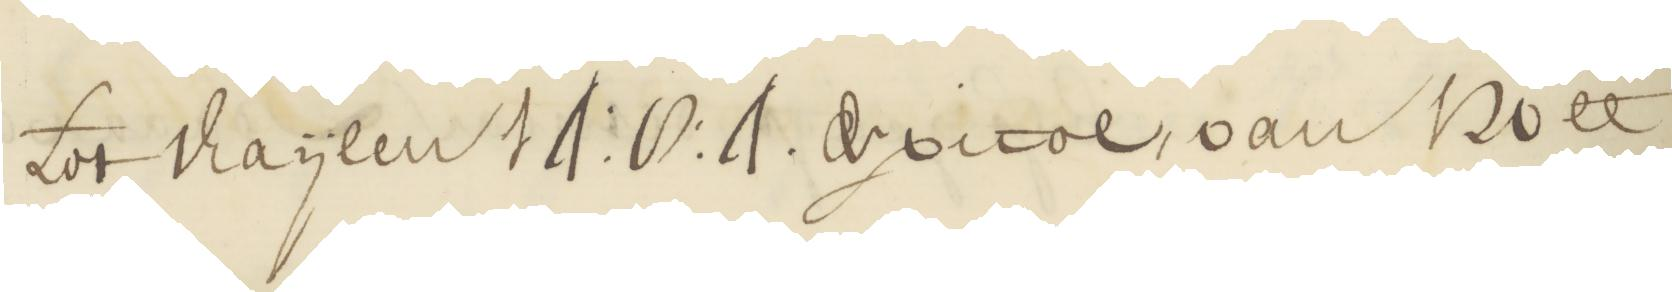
tot thaijlen 14:8:4. de picol, van 120 lb
